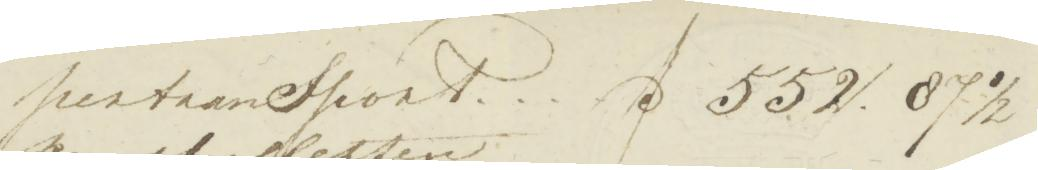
per transport... ƒ 552. 87½
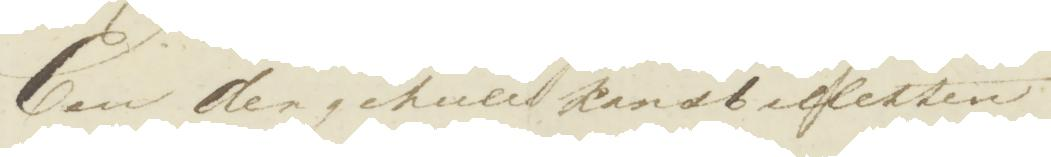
Een der geheele kansbiljetten
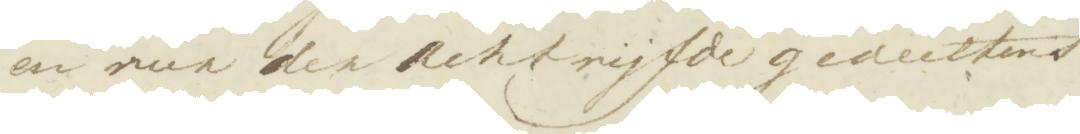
en vier der achtvijfde gedeeltens
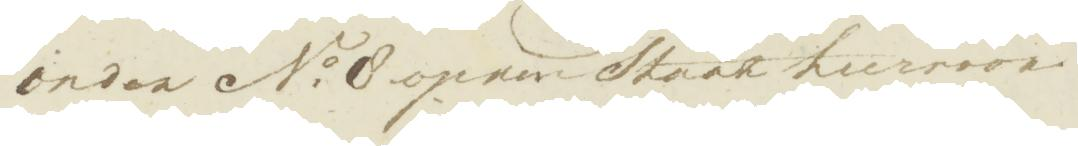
onder N.o 8 op den Staat hiervoor
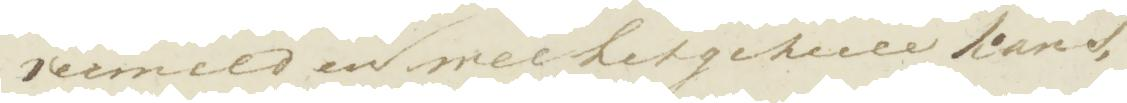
vermeld en wel het geheele kans
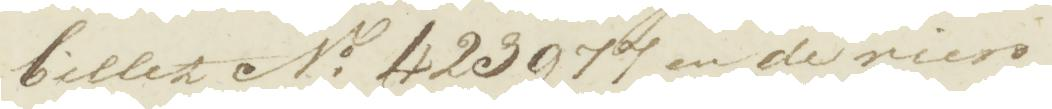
billet N.o 423977 en de vier
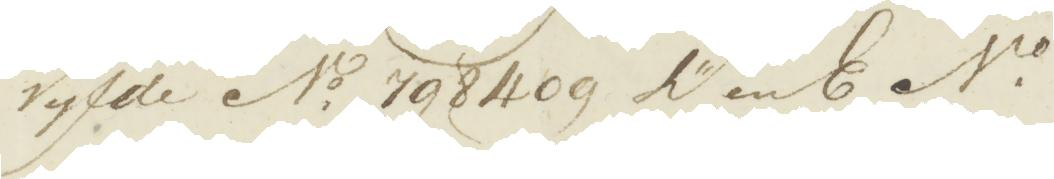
vyfde N.o 798409 D en E N.o
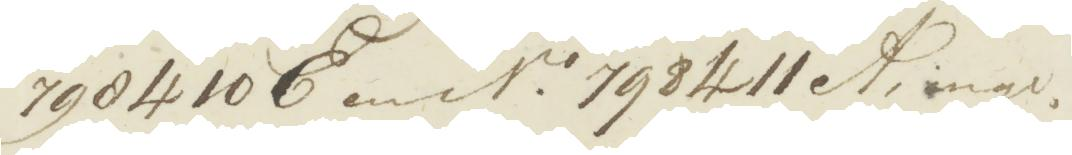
798410 E en N.o 798411 A, inge„
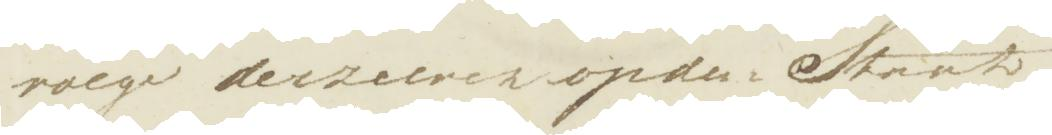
volge derzelven op den Staat
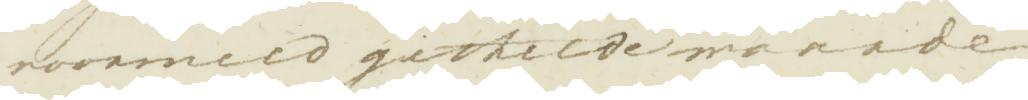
voormeld gestelde waarden
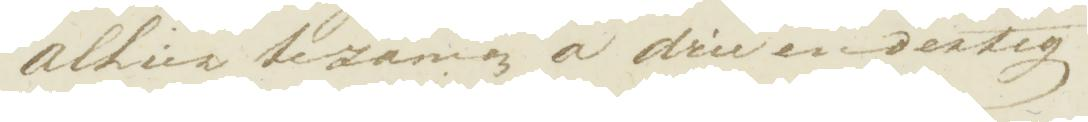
alhier te zamen a drie en dertig
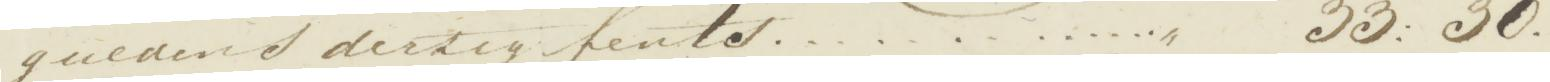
guldens dertig Cents . . . . . . . . . . . . . „ 33: 30.
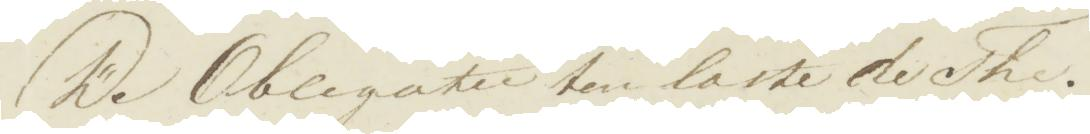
De Obligatie ten laste de The„
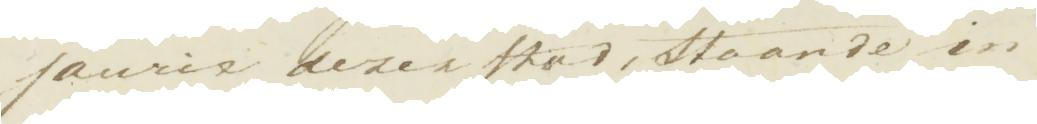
saurie dezer stad, staande in
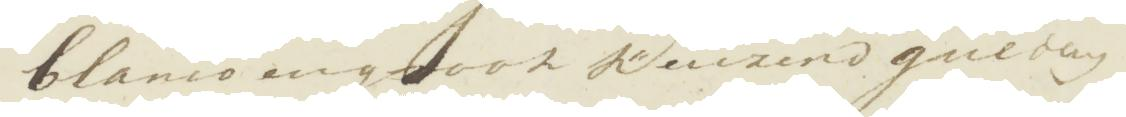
blanco en groot Duizend gulden
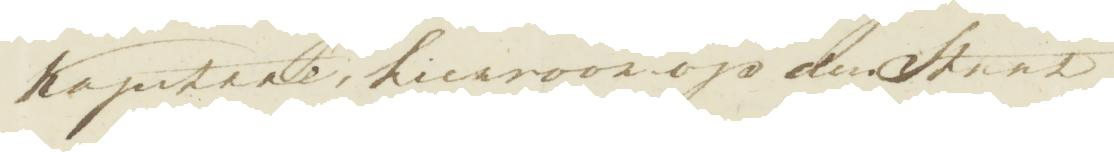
kapitaal, hiervoor op den Staat
